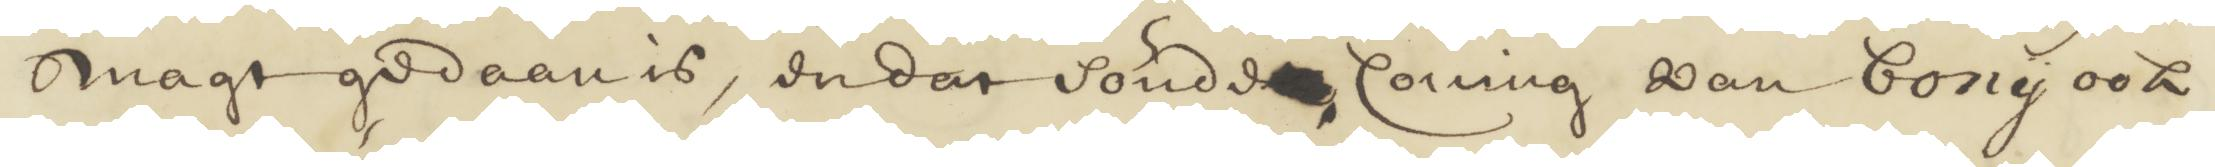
magt gedaan is, en dat soude Coning van bonij ook
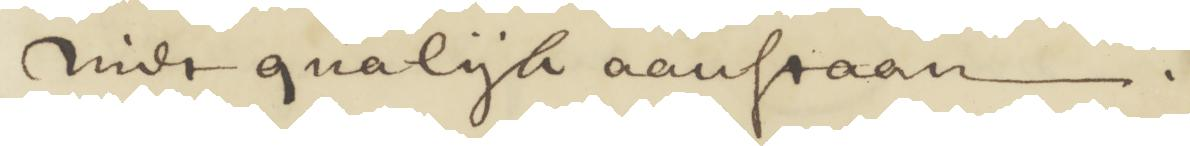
niet qualijk aanstaan.
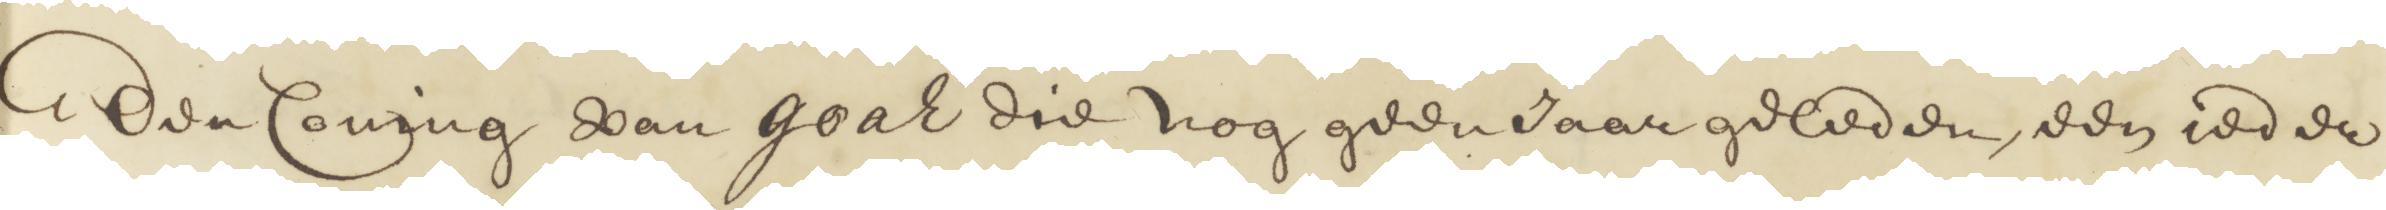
Den Coning van goah die nog geen Iaar geleden, een ieder
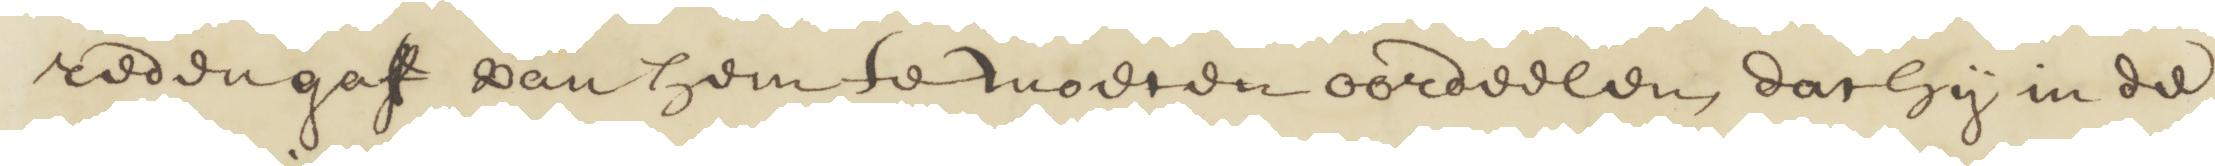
reden gaf van hem te moeten oordeelen, dat hij in de
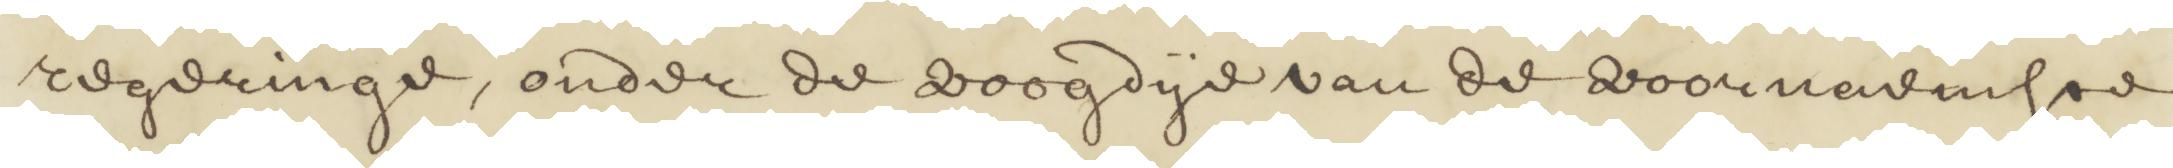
regeringe, onder de voogdije van de voornaemste
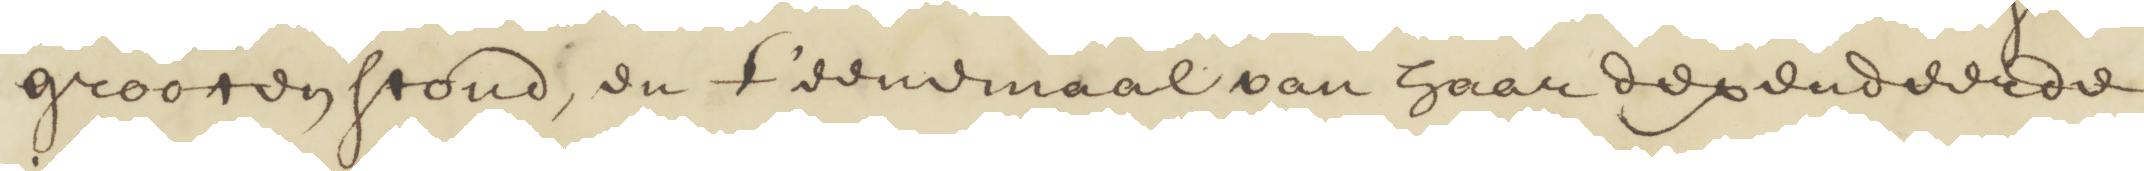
grooten stond, en t' eenemaal van haar dependeerde
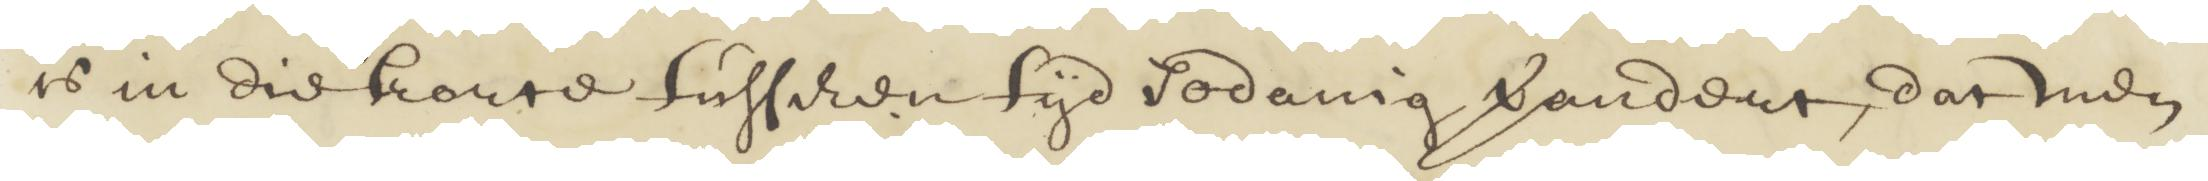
is in die korte tusschen tijd sodanig verandert, dat men
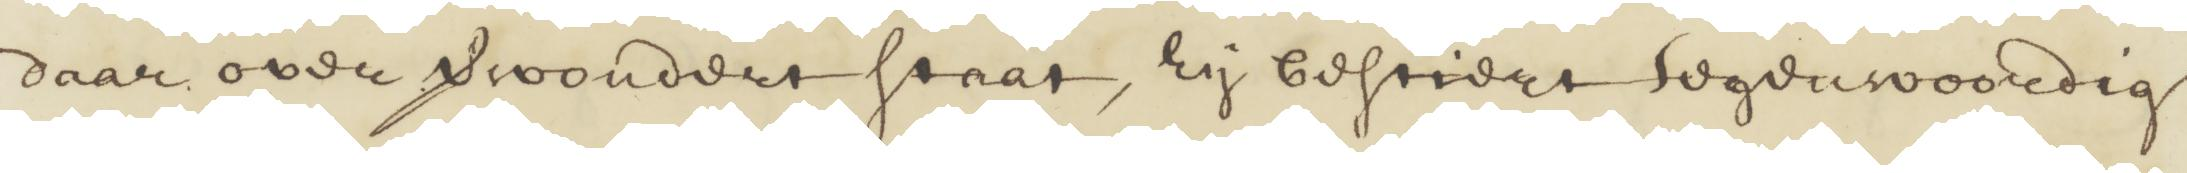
daar over verwondert staat, hij bestiert tegenwoordig
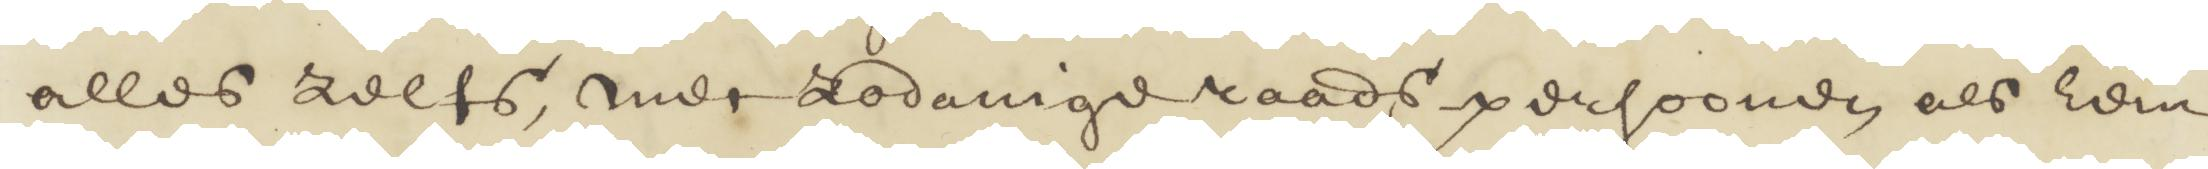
alles zelfs, met zodanige raads persoonen als hem
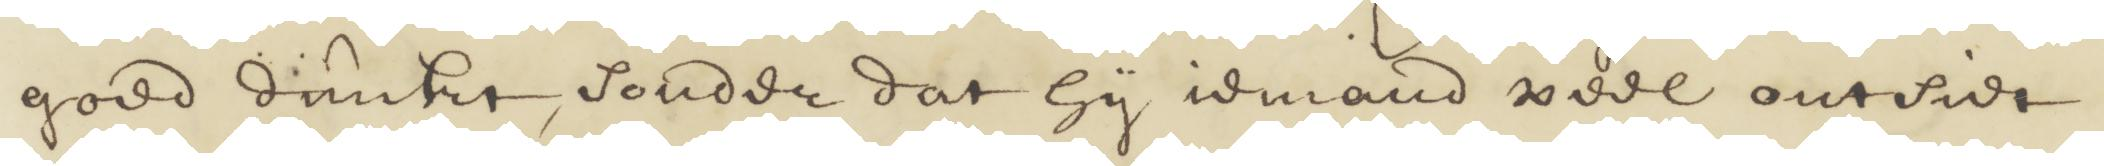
goed dunkt, sonder dat hij iemand veel ontsiet
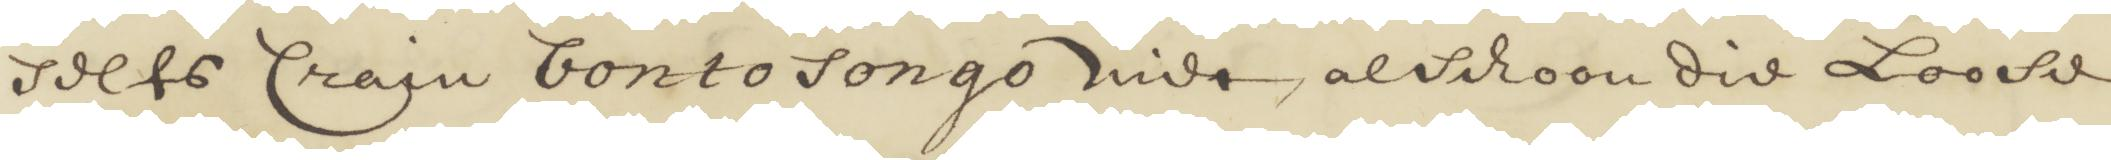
selfs Crain bonto songo niet, alschoon die Loose
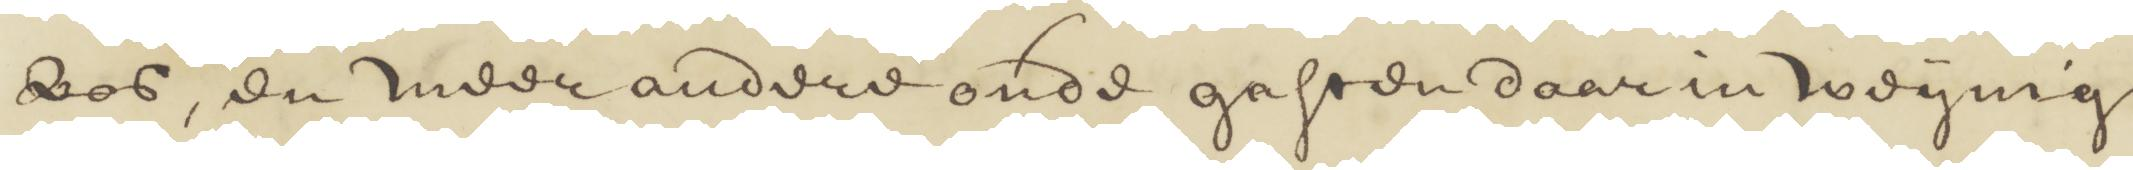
vos, en meer andere oude gasten daar in weijnig
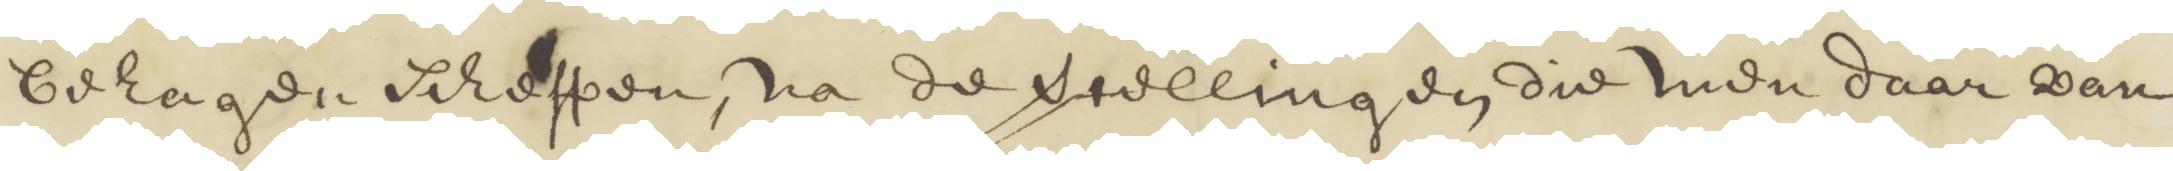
behagen scheppen, na de vertellingen die men daar van
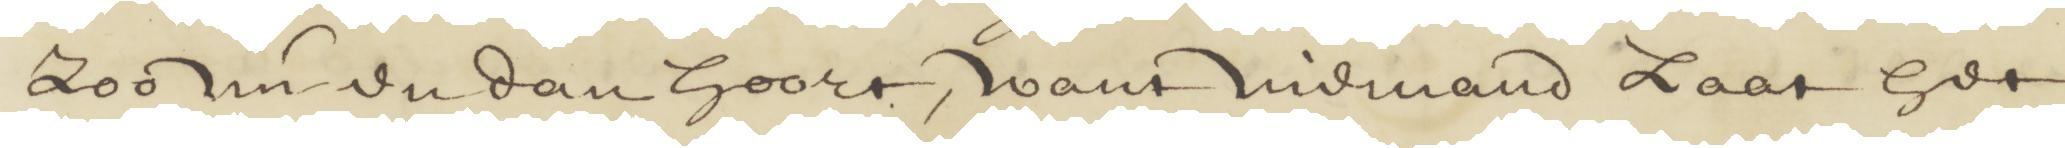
zoo nu en dan hoort., want niemand laat het
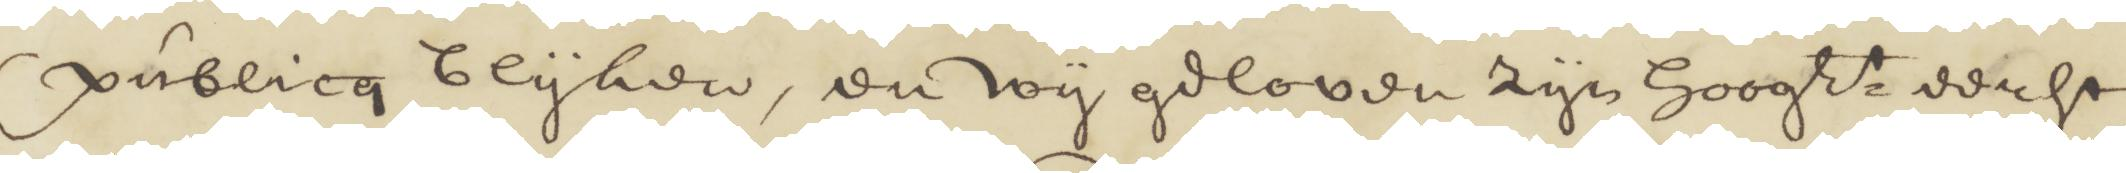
publicq blijken, en wij geloven zijn hoogh=t eerst
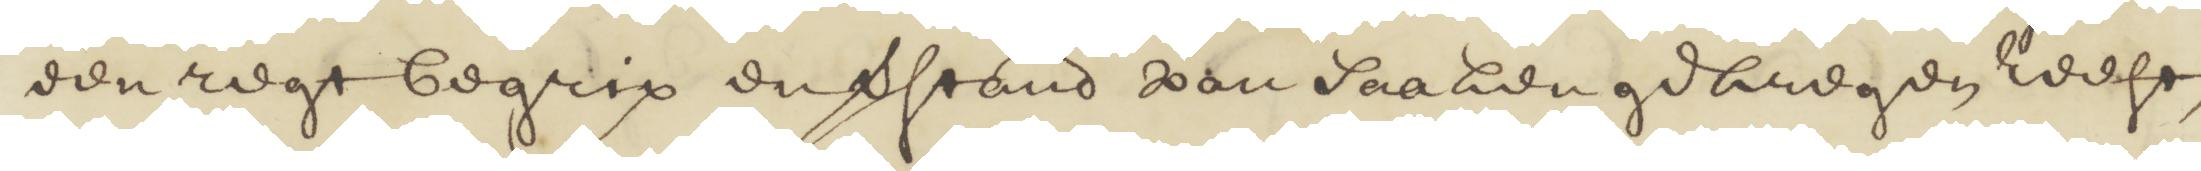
een regt begrip en verstand van saaken gekregen heeft,
